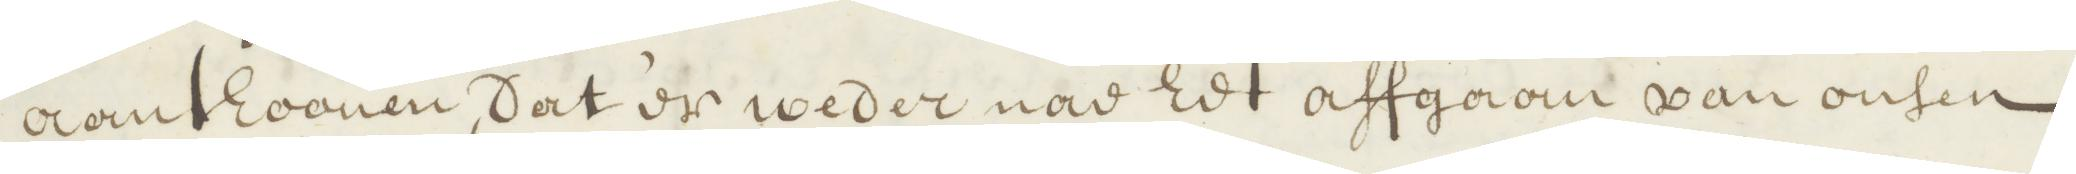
aanthoonen, dat 'er weder nae het affgaan van onsen
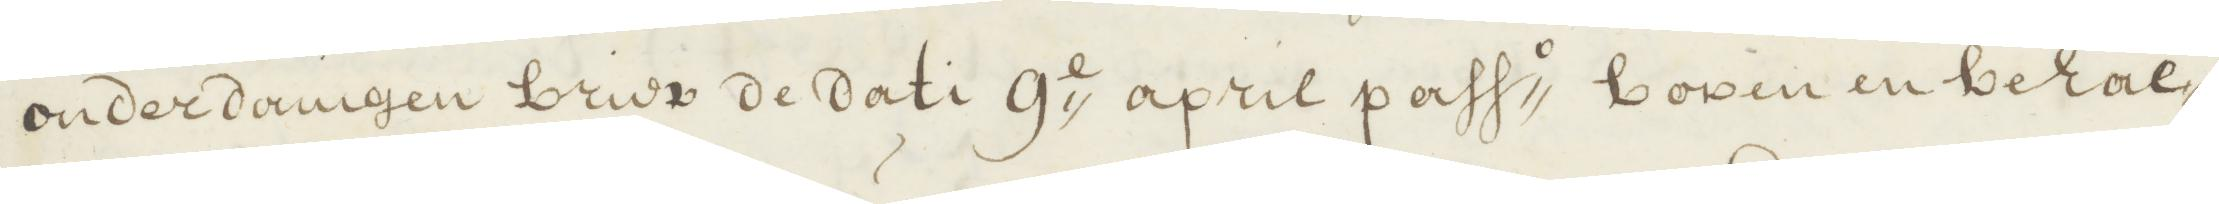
onderdanigen briev de dati 9„e april pass„o boven en behal„
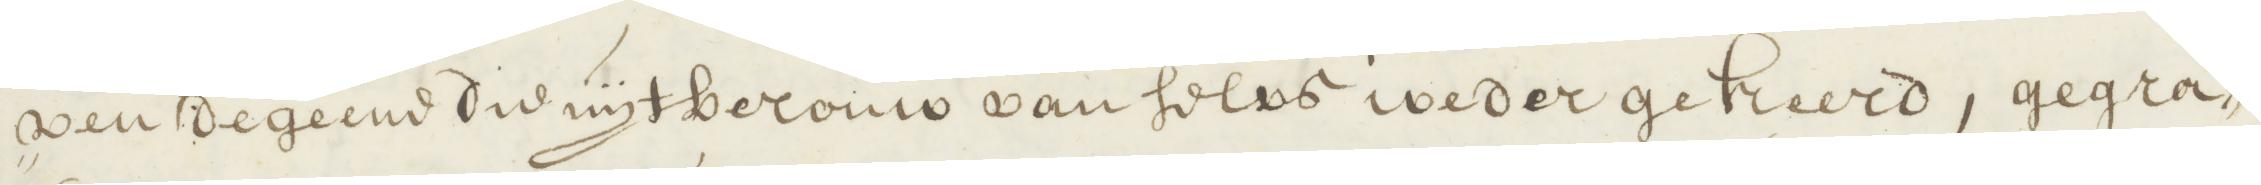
ven de geene die uijt berouw van selvs weder gekeerd, gegra„
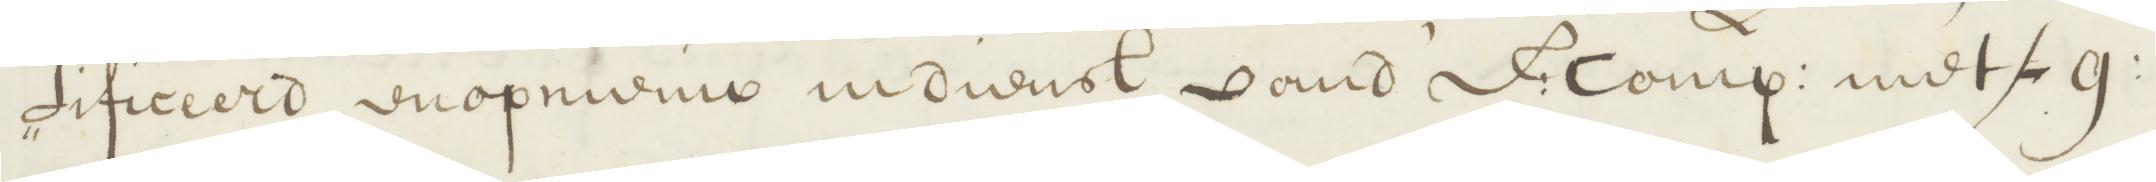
tificeerd en opnieuw in dienst vand' E: Comp: met ƒ9:
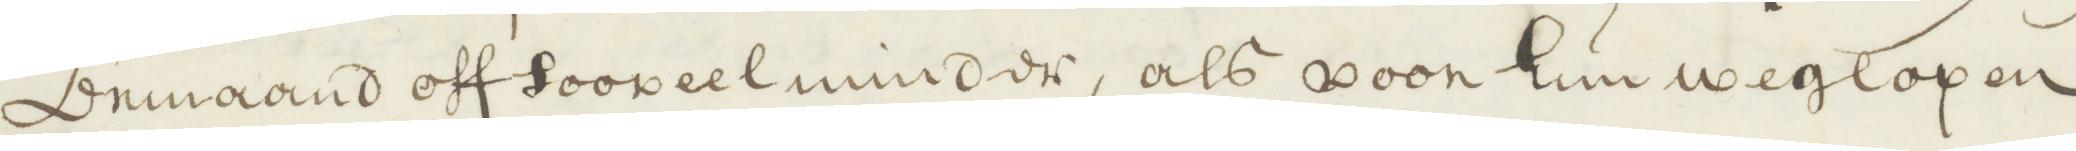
termaand off sooveel minder, als voor hun weglopen
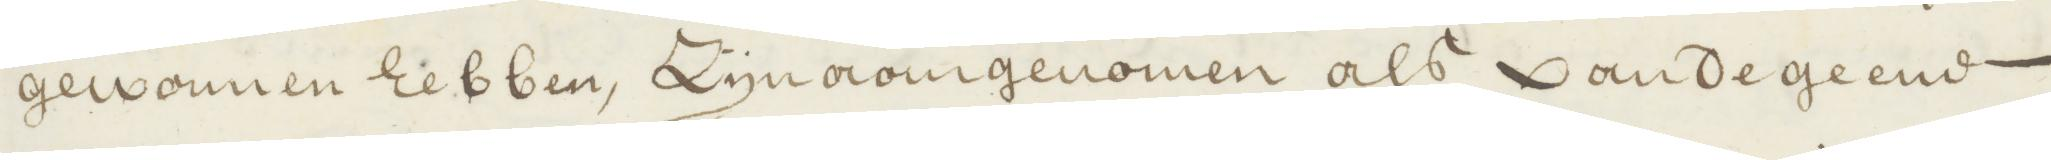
gewonnen hebben, Zijn aangenomen als van de geene
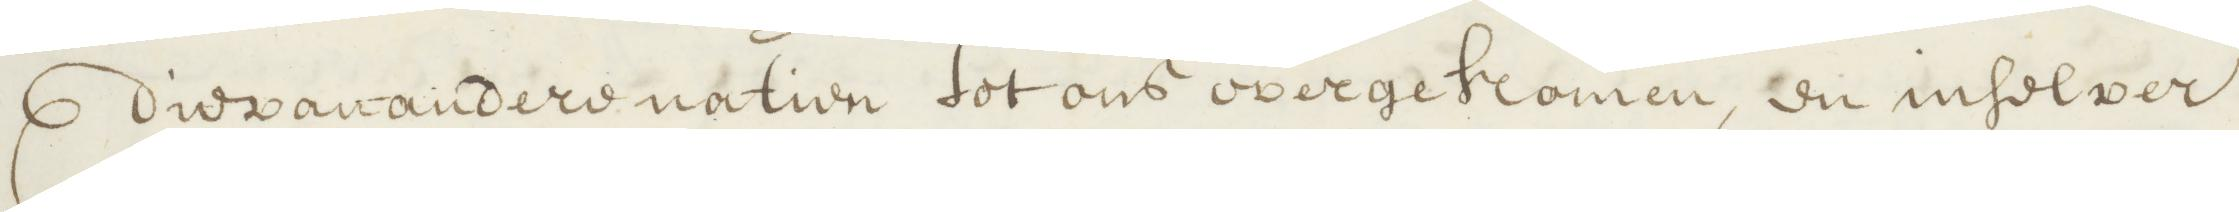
die van andere natien tot ons overgekomen, en inselver
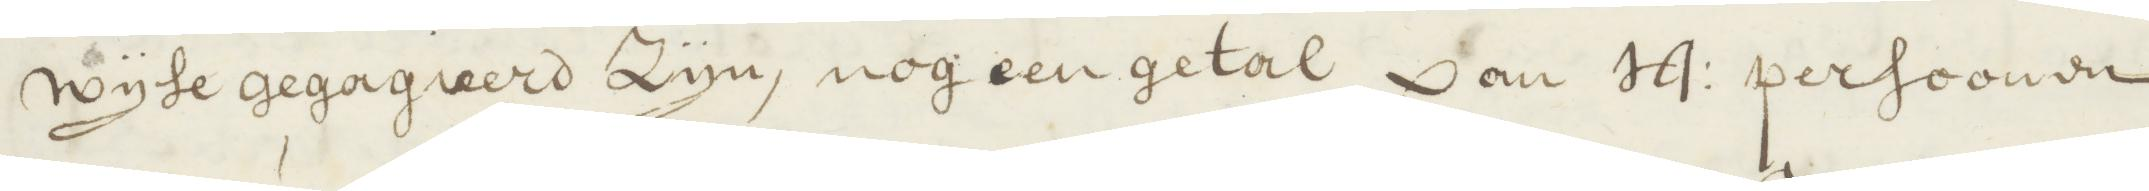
wijse gegagieerd zijn, nog een getal van 14: persoonen
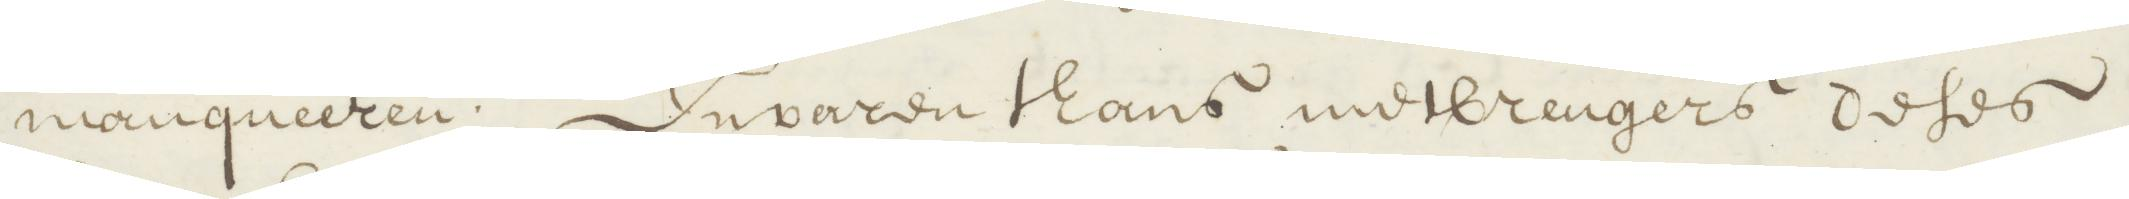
manqueeren: En varen thans metbrengers deses
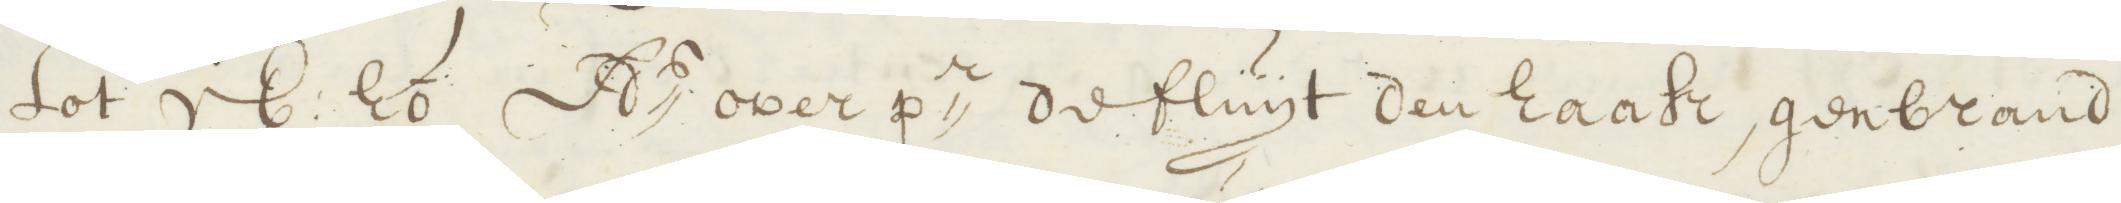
tot VE: ho Ed„s over p„r de fluijt den haak, gerbrand
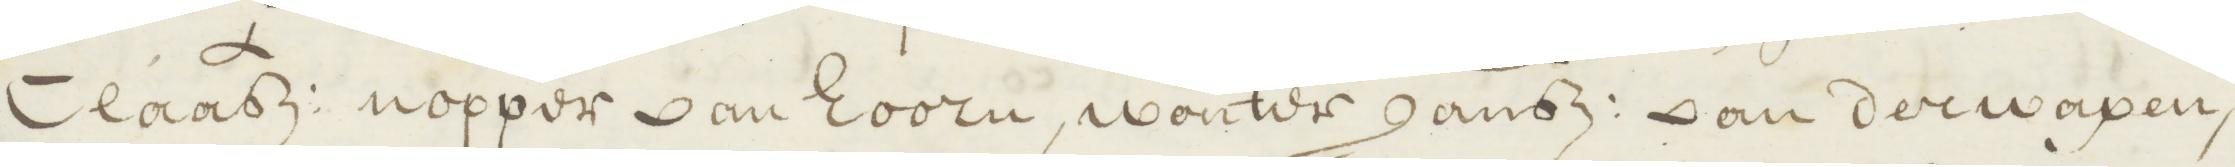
Claasz: nopper van hoorn, wouter jansz: van der wapen,
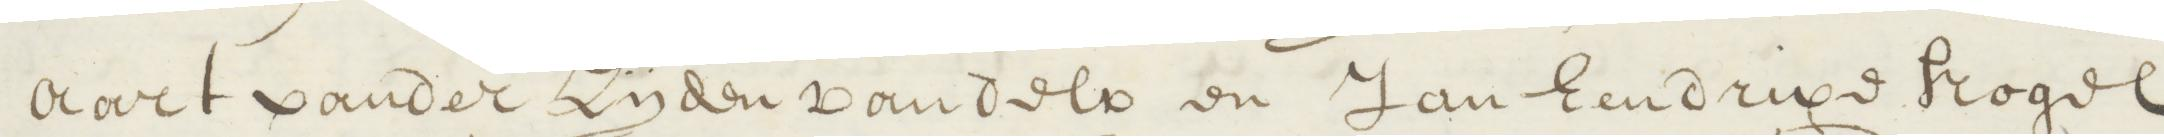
aart vander zijden van delv en Ian hendrixe kogel
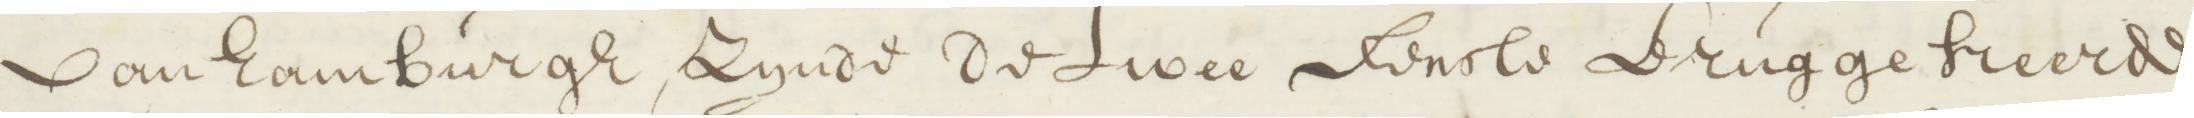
van hamburgh, zynde de twee Eerste teruggekeerde
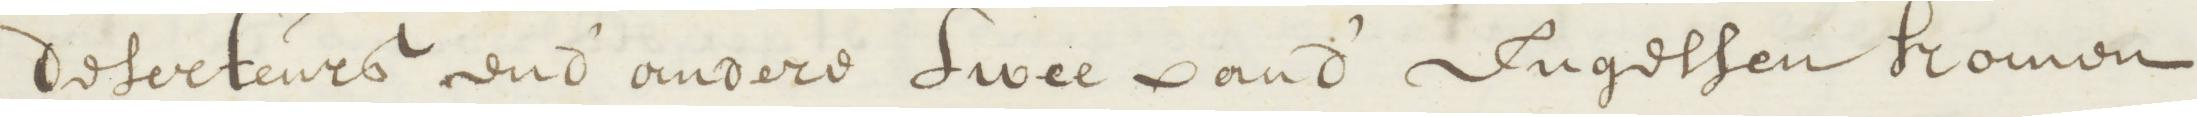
deserteurs en d’ andere twee van d’ Engelsen komen
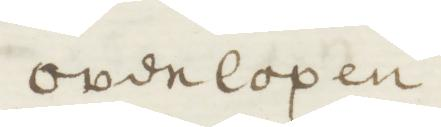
overlopen
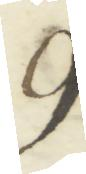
97:
